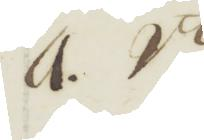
4. v=t
